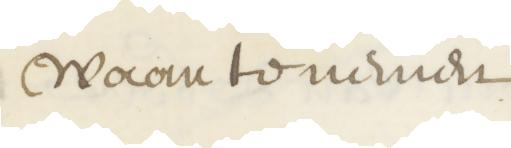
waar te nemen
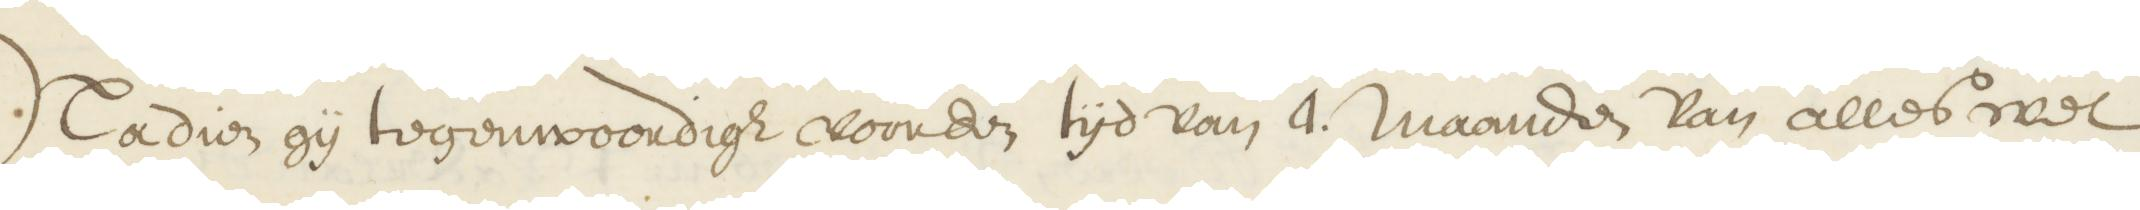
Nadien gij tegenwoordigh voorden tijd van 4. maanden van alles wel
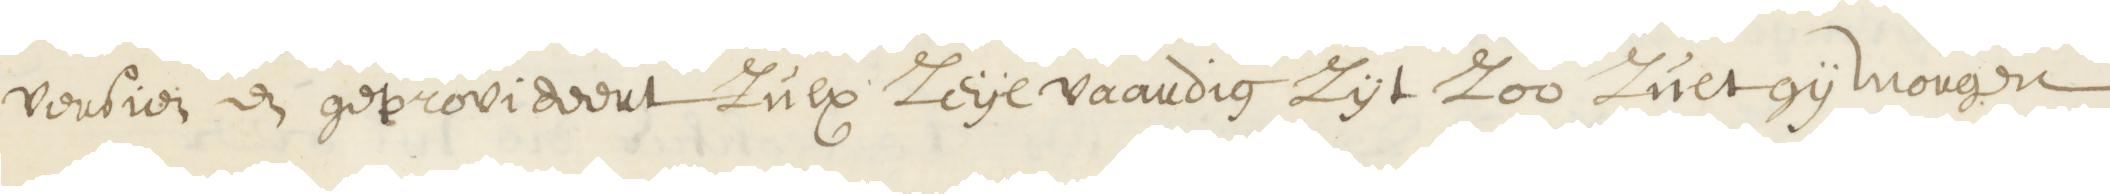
versien en geprovideert Zulx Zeijlvaardig Zijt Zoo Zult gij morgen
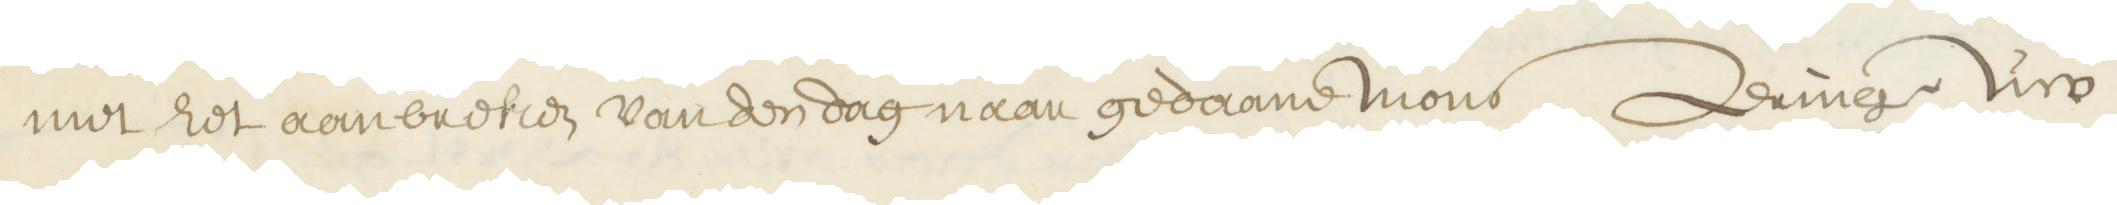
met het aanbreken van den dag naar gedaane monsteringe uw
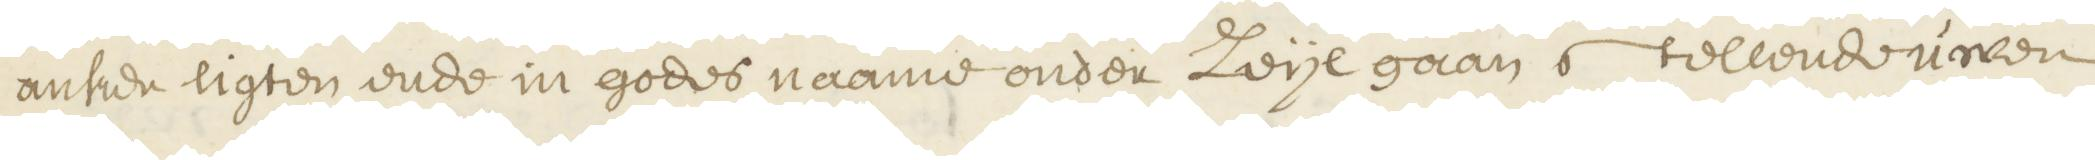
anker ligten ende in godes naame onder Zeijl gaan stellende uwen
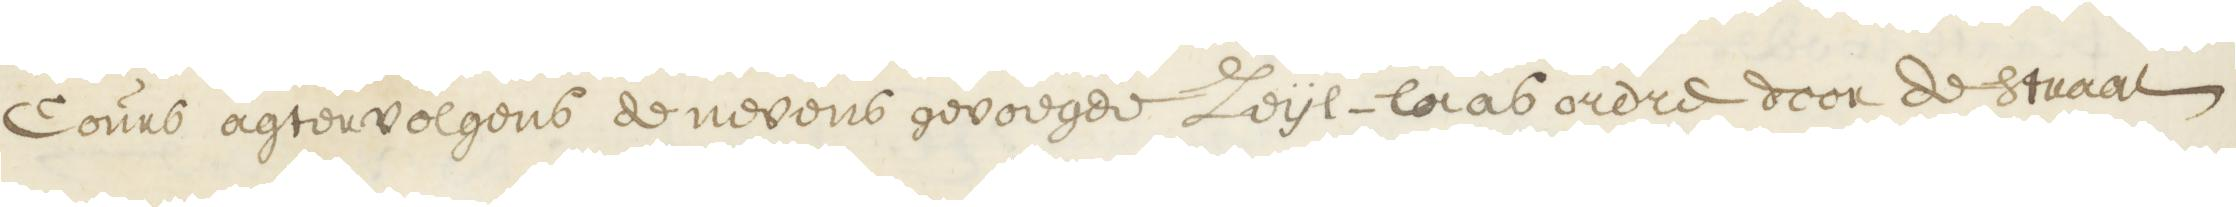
Cours agtervolgens de nevens gevoegde Zeijl-kasordre door de straat
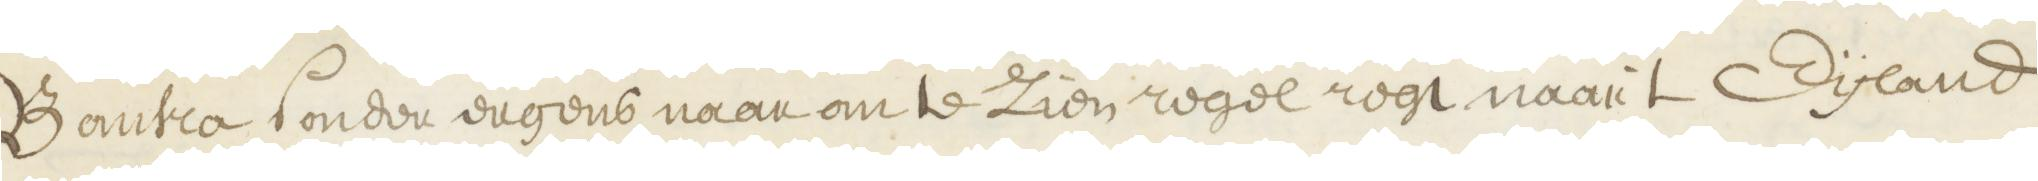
Banka sonder ergens naar om te Zien regel regt naar ’t Eijland
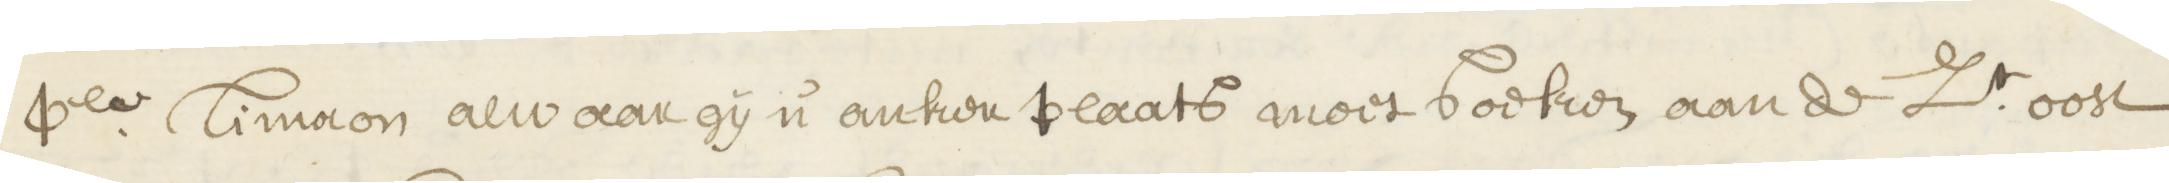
p:lo Timaon alwaar gij u ankerplaats moet boeken aan de Zt. oost
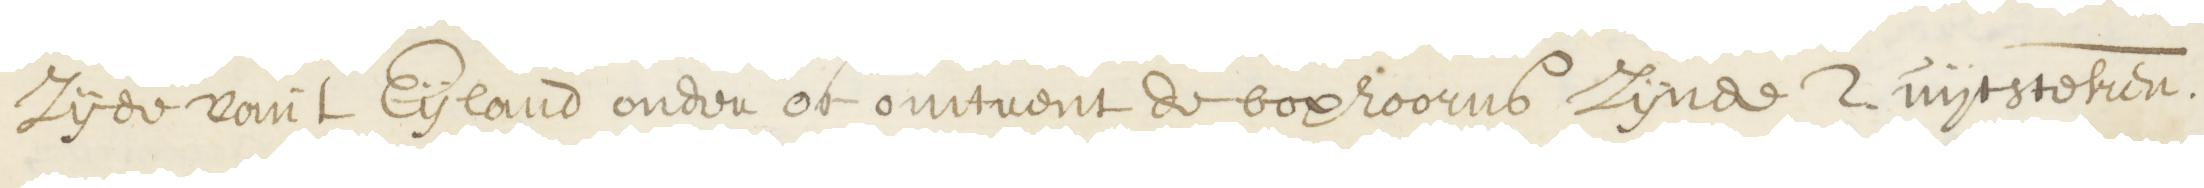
zijde van ’t Eijland onder of omtrent de boxhoorns Zijnde 2 uijtsteken.
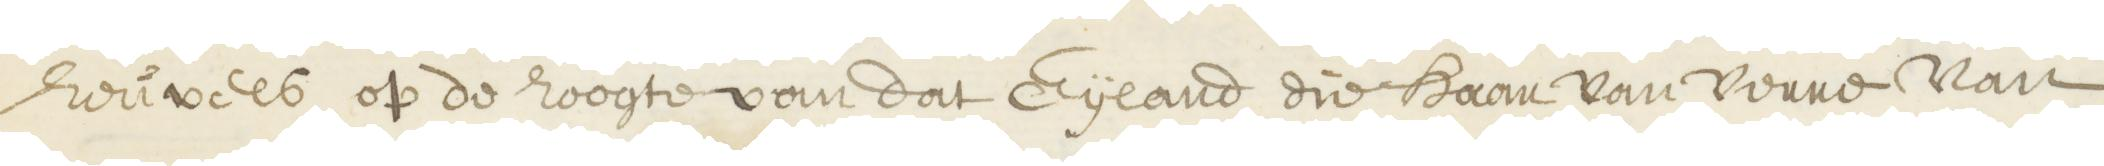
heuvels op de hoogte van dat Eijland die haar van verre van
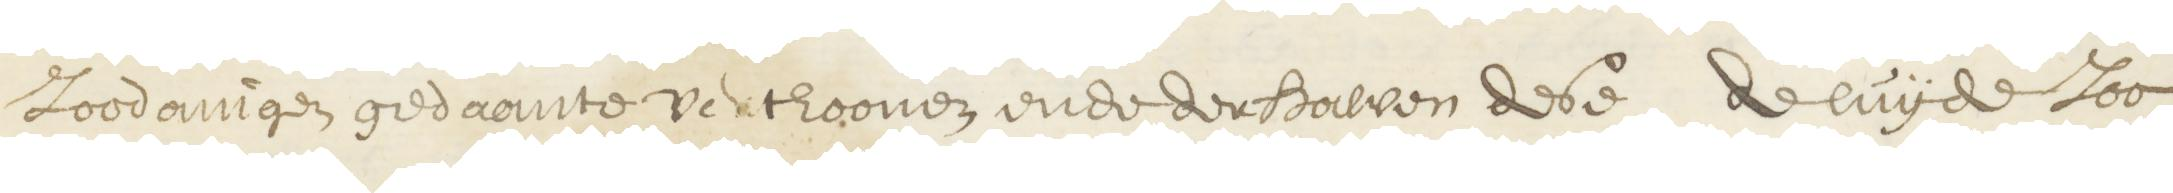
Zoodanigen gedaante verthoonen ende derhalven dese deluijde Zoo
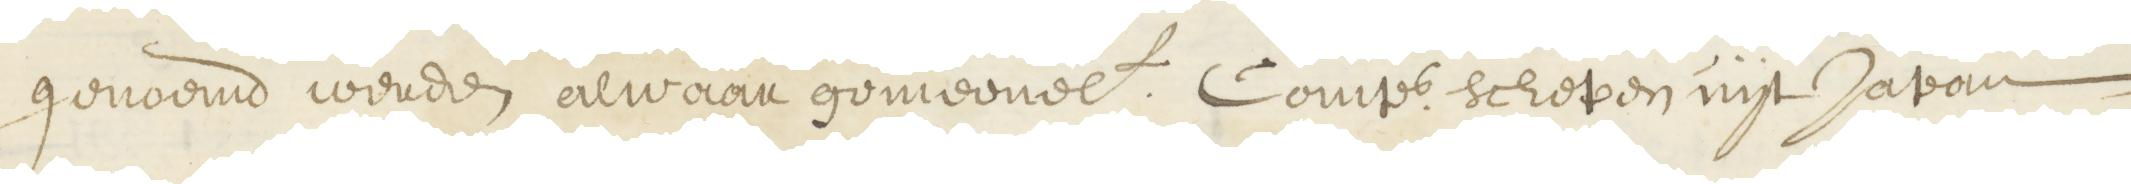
genoemd werden alwaar gemeenelijk Comp.s schepen uijt Japan
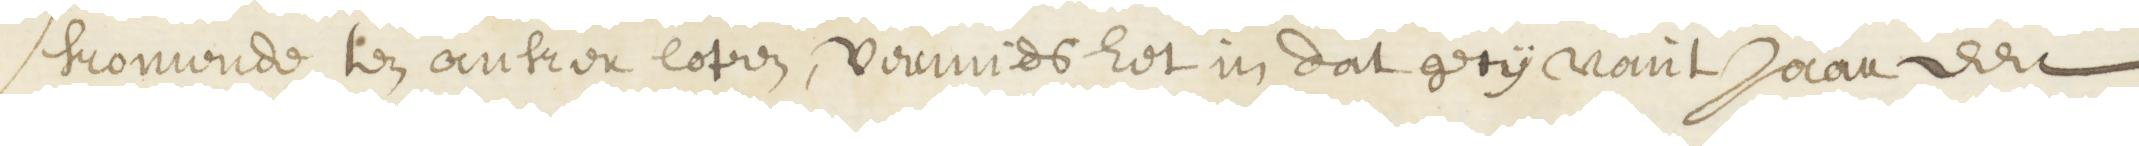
komende ten anker lopen, vermids het in dat getij van ’t jaar een
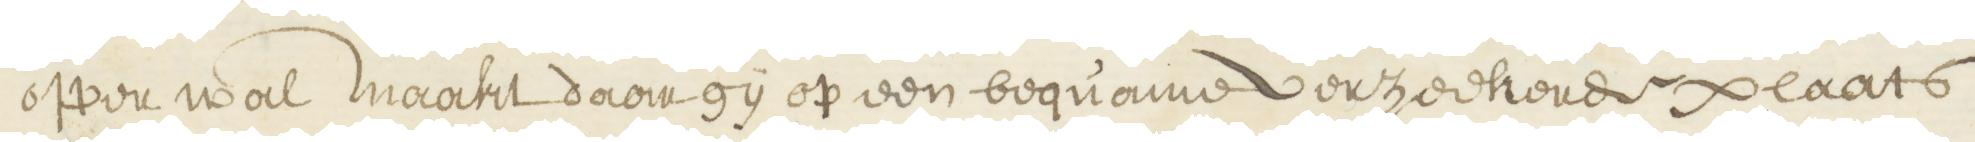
opperwal maakt daar gij op een bequame verzeekerde plaats
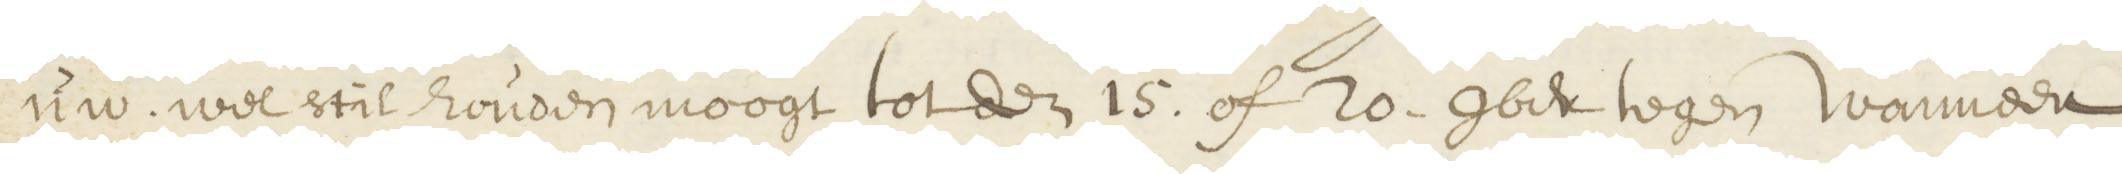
uw. wel stil houden moogt tot den 15. of 20. 9ber tegen wanneer
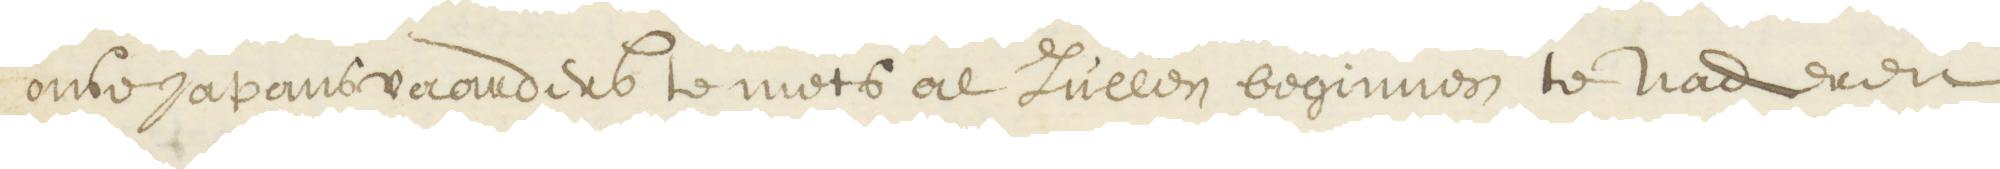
onse japans vaarders te mets al Zullen beginnen te naderen
